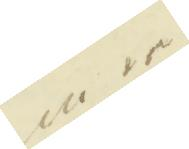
m m
